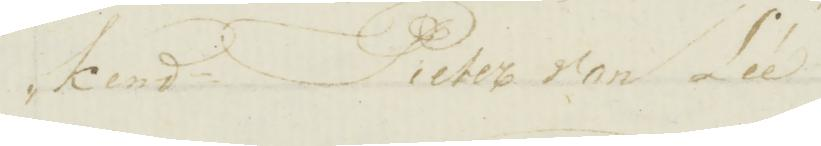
„kend= Pieter van Lee
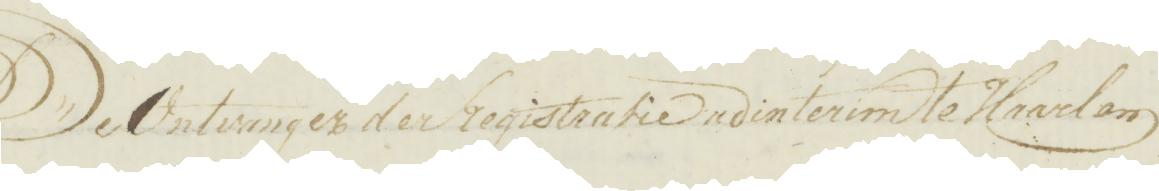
De Ontvanger der registratie ad interim te Haarlem,
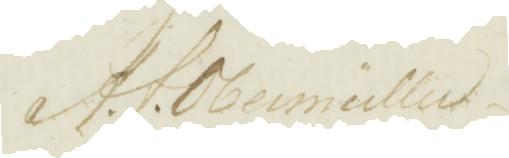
A. F. Obermüller
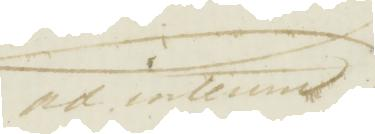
ad interim
